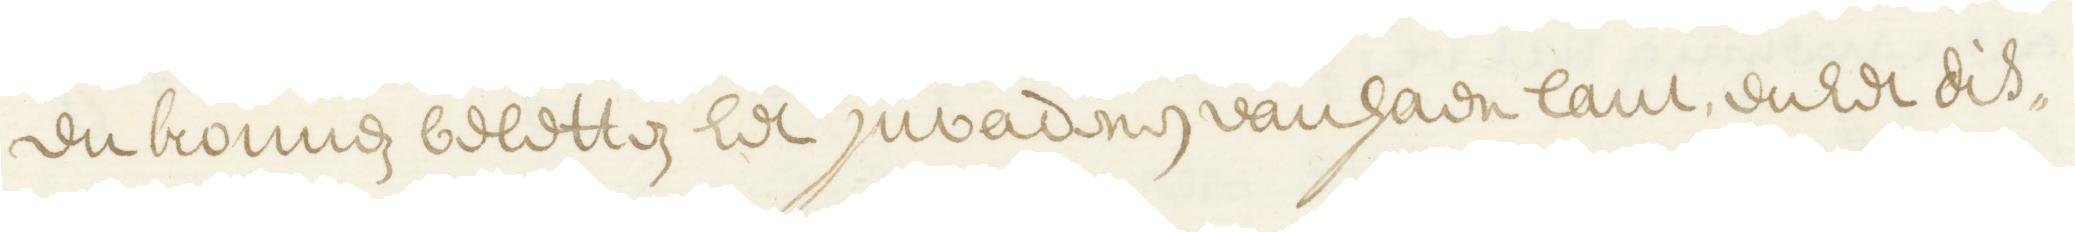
en konnen beletten het jnvaderen van haer lant, en het dis„
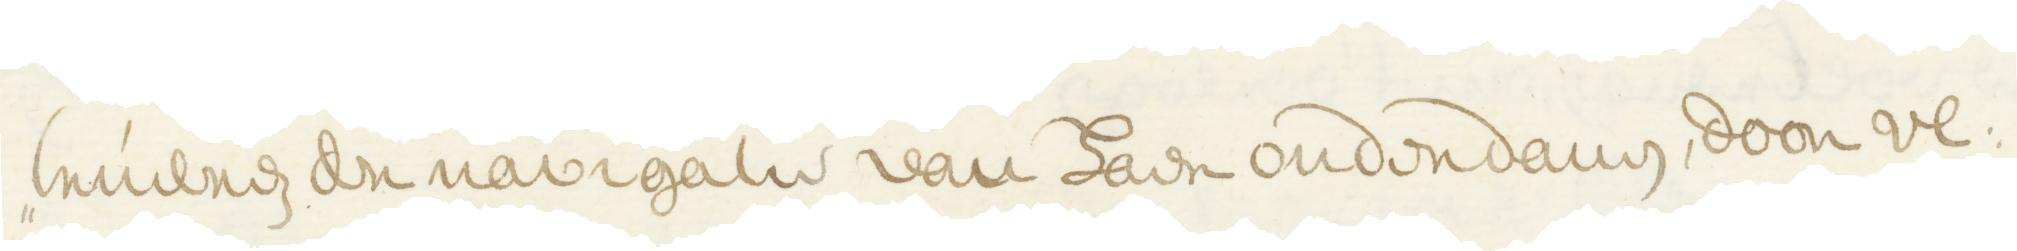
„trueren der navigatie van haer onderdanen, door vl:
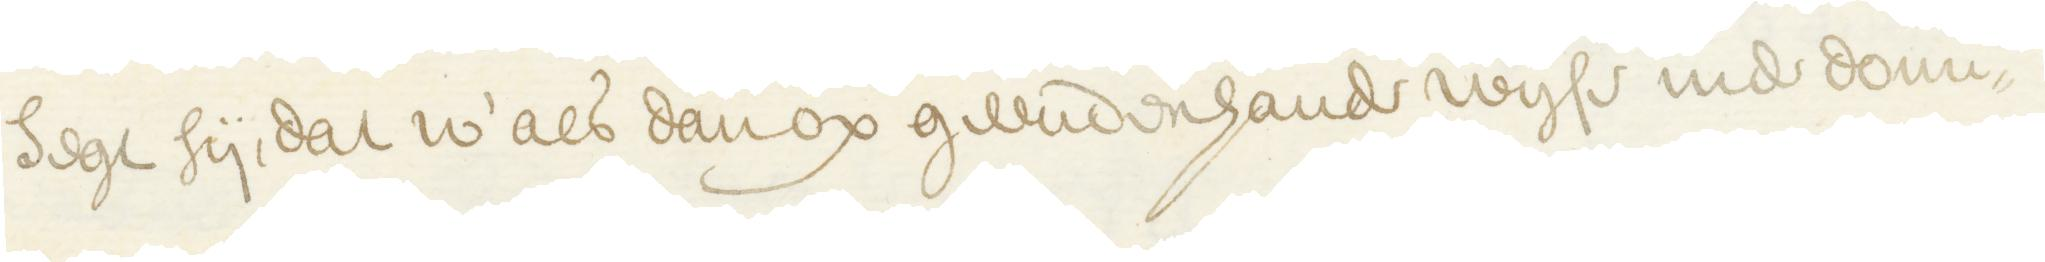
segt sij, dat w' als dan op geenderhande wijse inde domi„
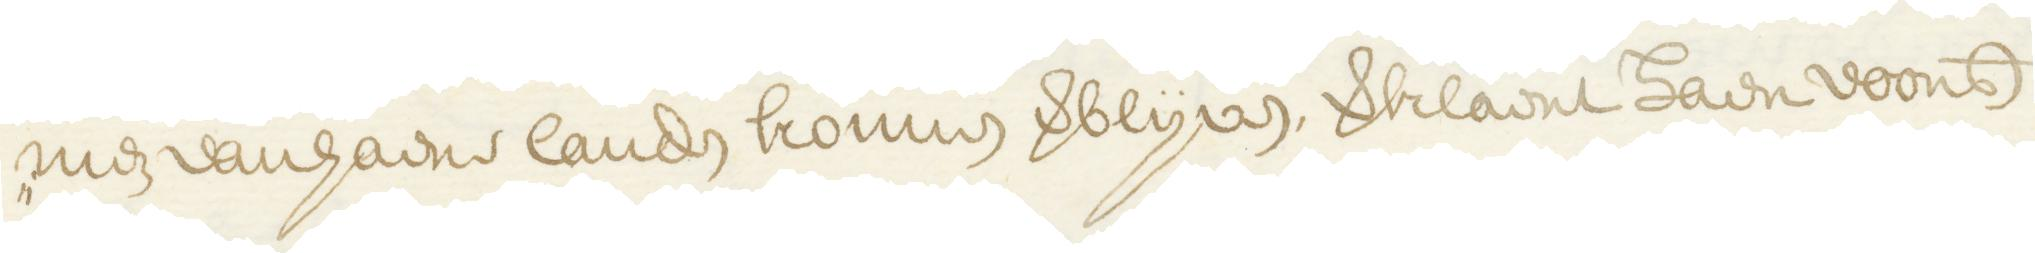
„men van haere landen konnen verblijven, verklaert haer voorsz
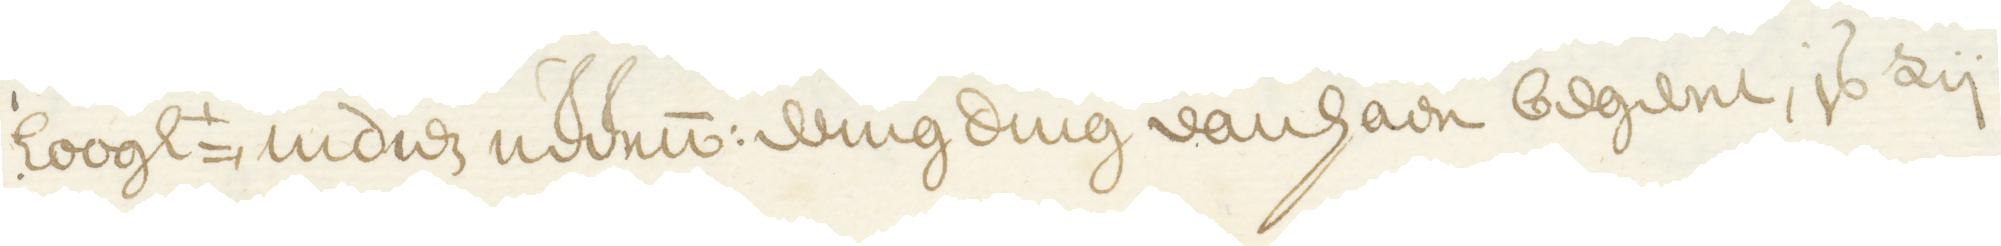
hoogh=t, indien uEErw: eenig ding van haer begert, is zij
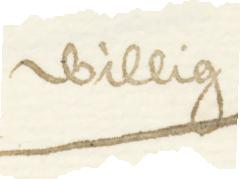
willig
